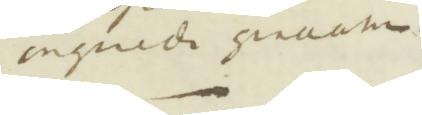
ongerede geraakt
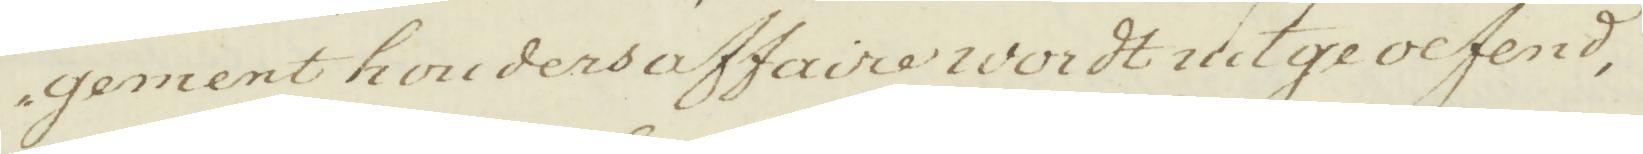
„gement houders affaire wordt uitgeoefend,
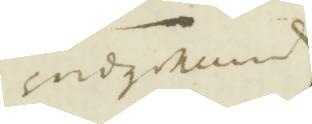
onder namen
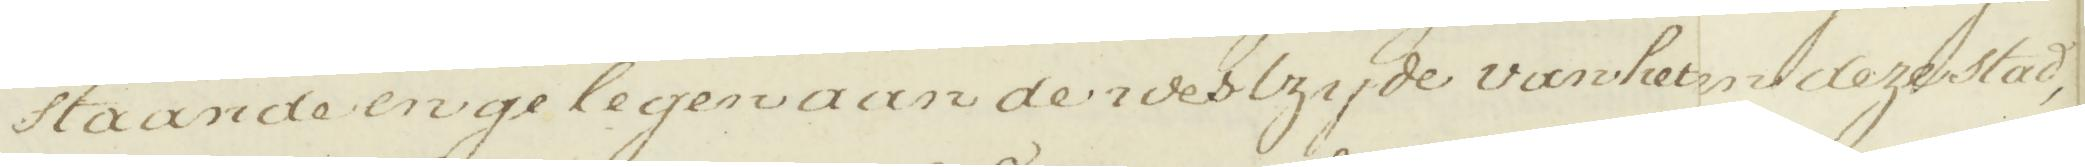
staande en gelegen aan de westzyde van het
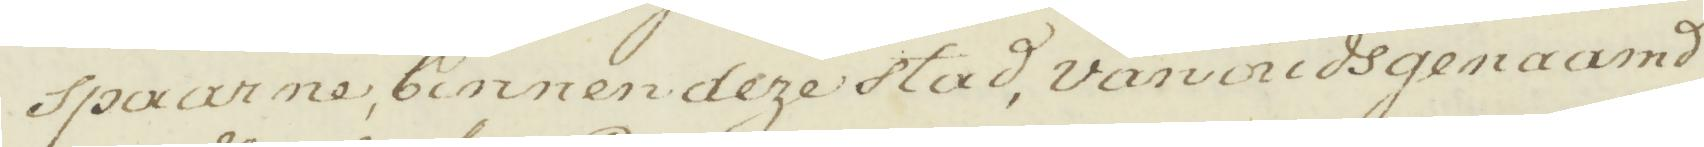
spaarne, binnen deze stad, van ouds genaamd
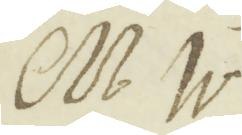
M W
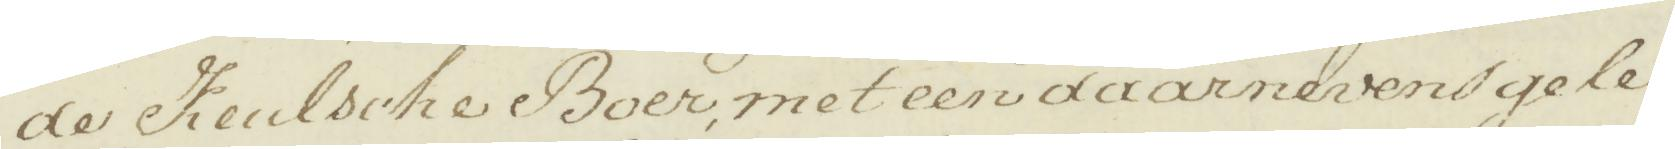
de Keulsche Boer, met een daarnevens gele
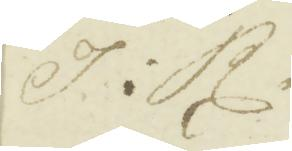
I:R:
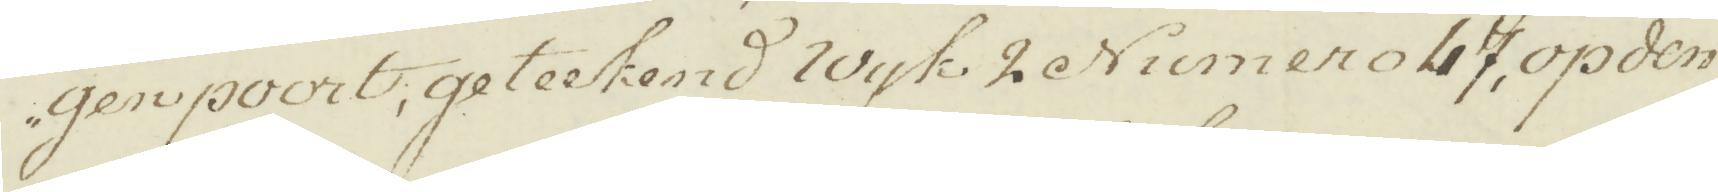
„gen poort; geteekend Wyk 2 Numero 47, op den
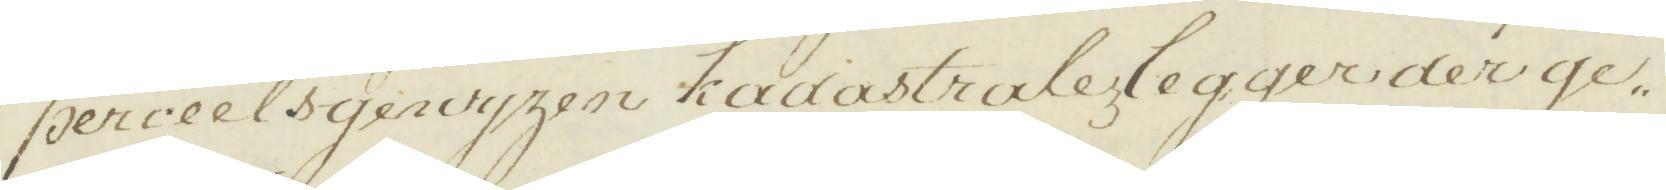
perceelsgewyzen kadastrale legger der ge„
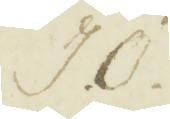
I O
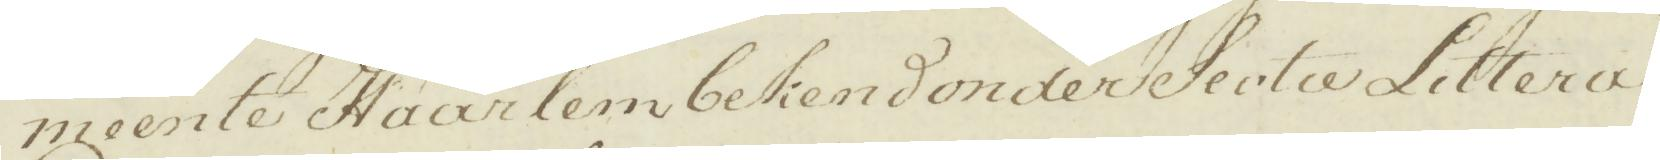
meente Haarlem bekend onder Sectie Littera
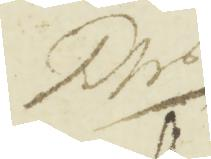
DWs
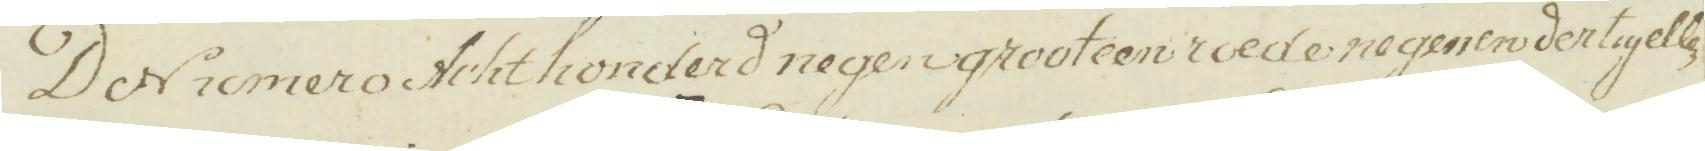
D Numero Achthonderd negen groot een roede negen en dertig ellen
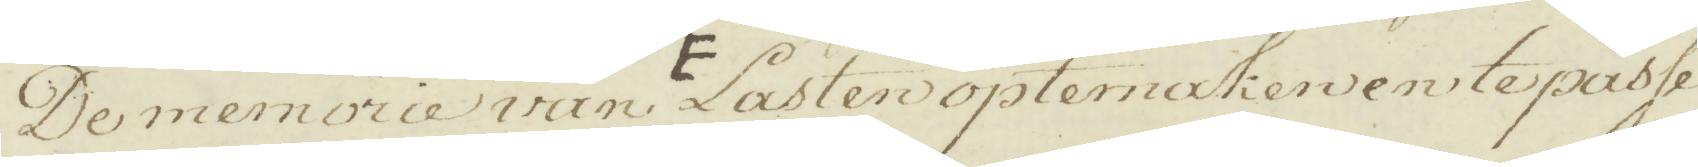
De memorie van E Lasten op temaken en te passe
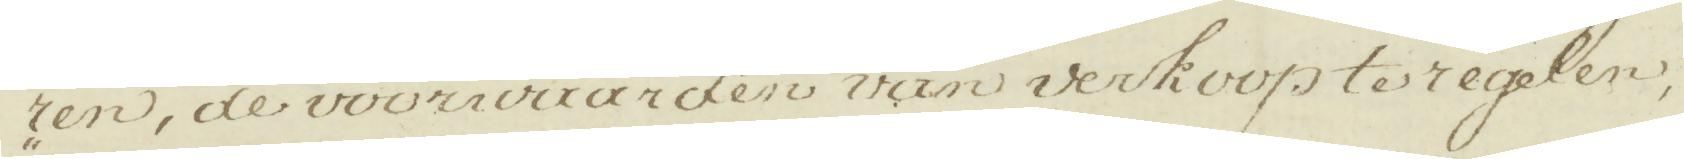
„ren, de voorwaarden van verkoop te regelen,
